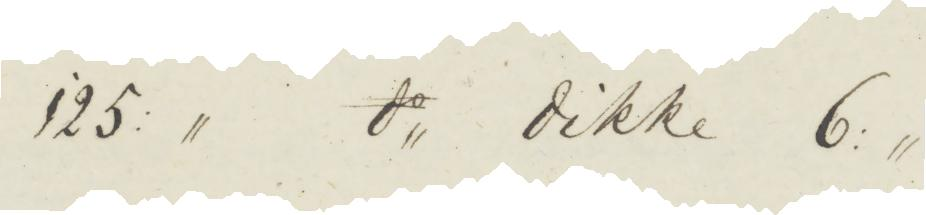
125: „ d„o dikke 6: „
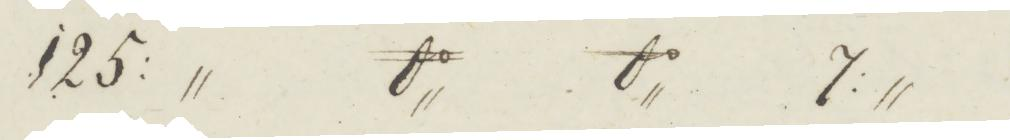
125: „ d„o d„o 7: „
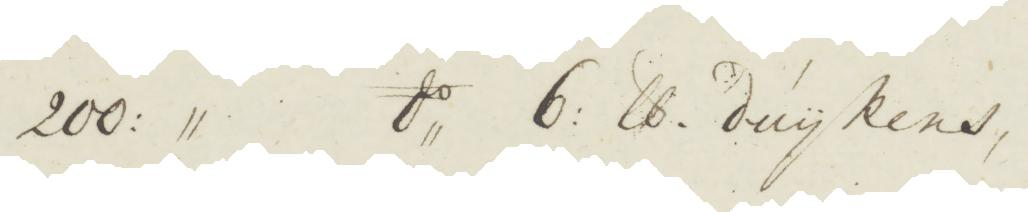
200: „ d„o 6: lb. duijkers,
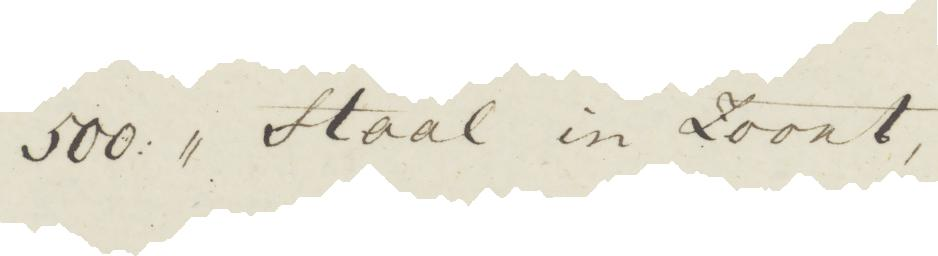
500: „ staal in zoort,
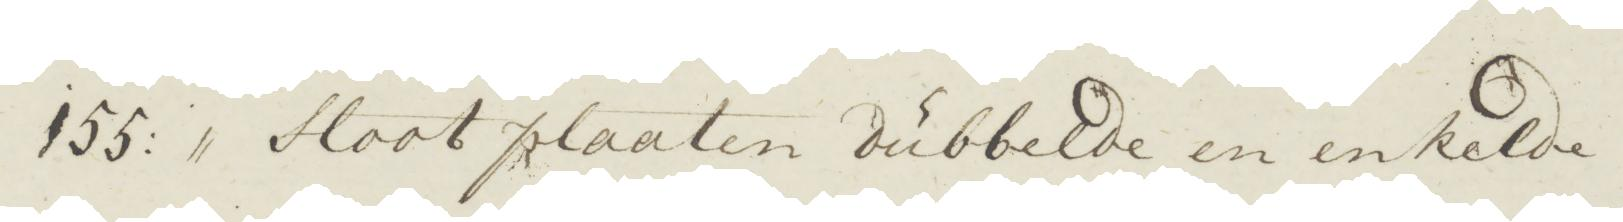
155: „ sloot plaaten dubbelde en enkelde
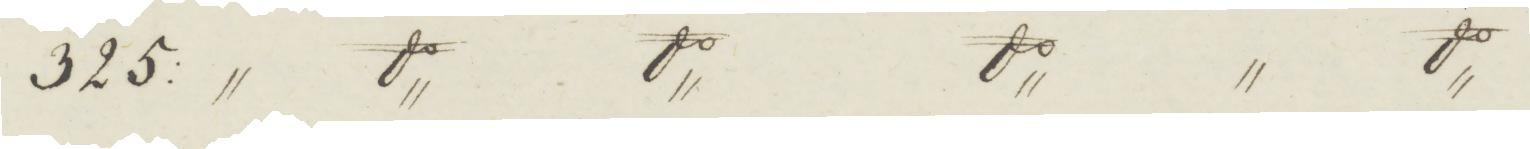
325: „ d„o d„o d„o „ d„o
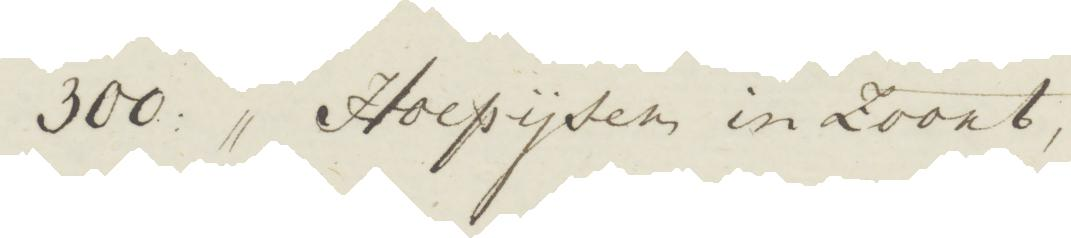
300: „ Hoepijser in zoort,
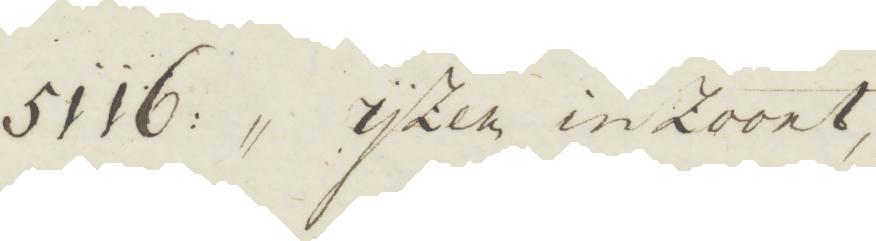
5116: „ ijzer in zoort,
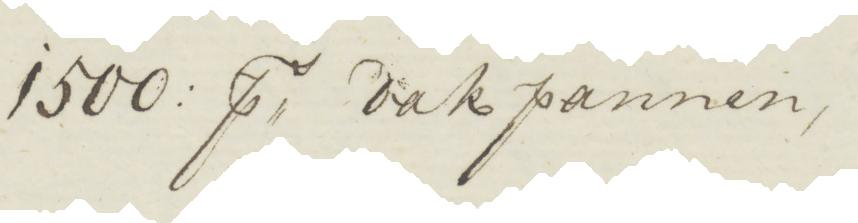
1500: p„s dak pannen,
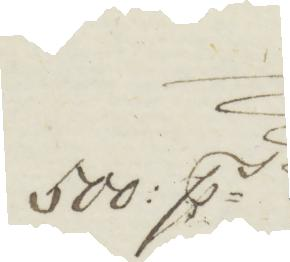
500: p=s
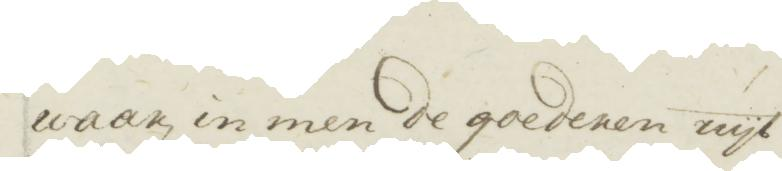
waar in men de goederen uijt
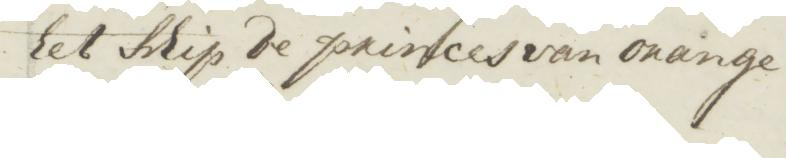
het schip de princes van orange
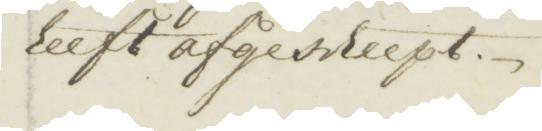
heeft afgescheept. —
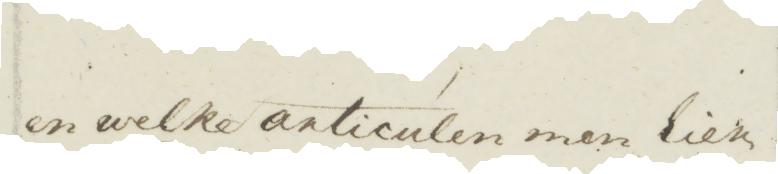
en welke articulen men hier
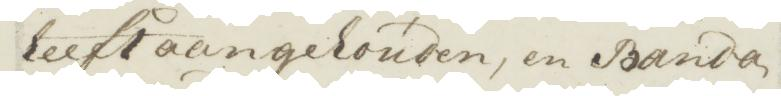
heeft aangehouden, en Banda
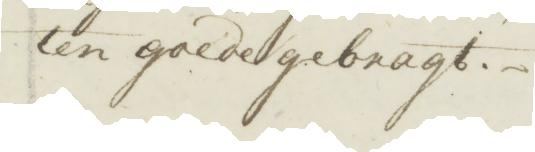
ten goede gebragt. —
